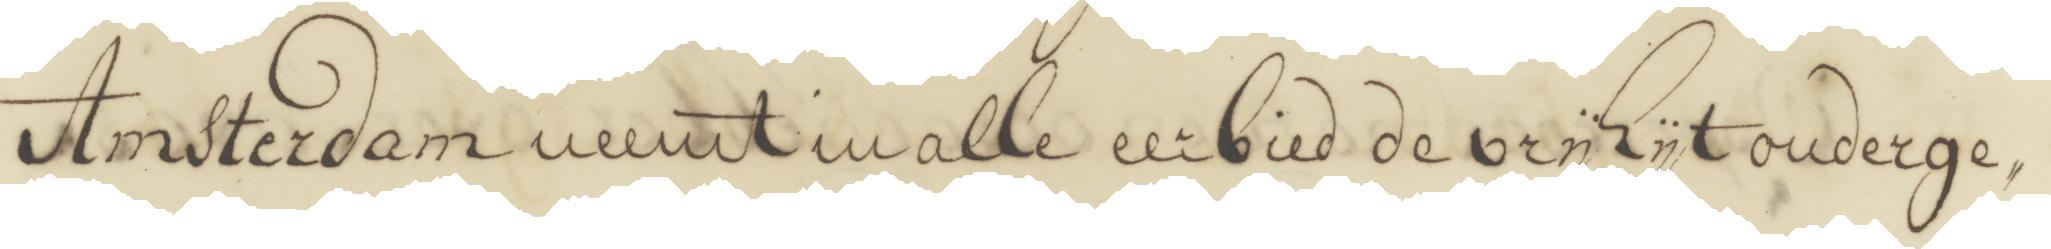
Amsterdam neemt in alle eerbied de vrijhijt onderge„
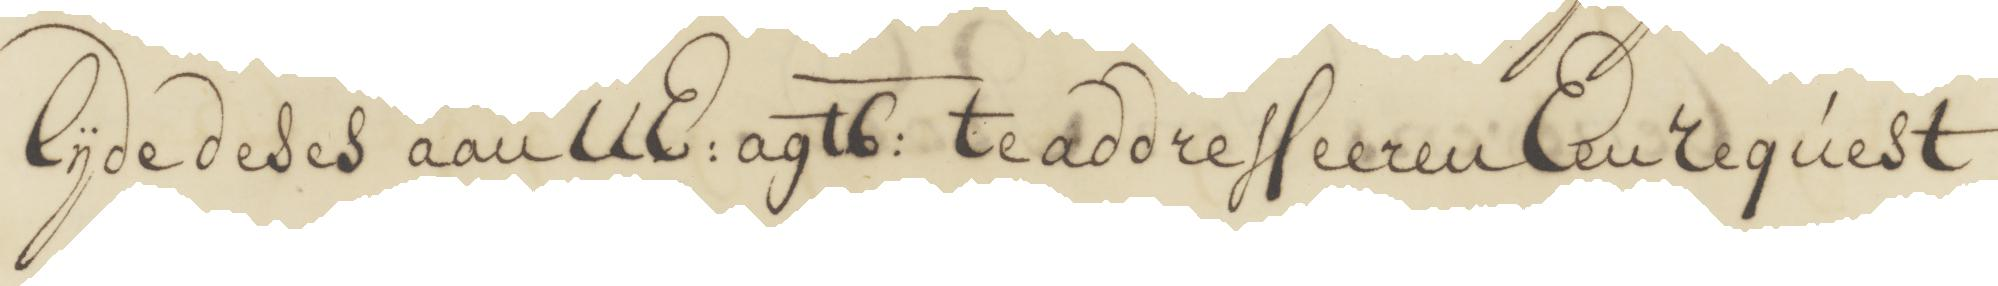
lijde deses aan UE: agtb: te addresseeren Een request
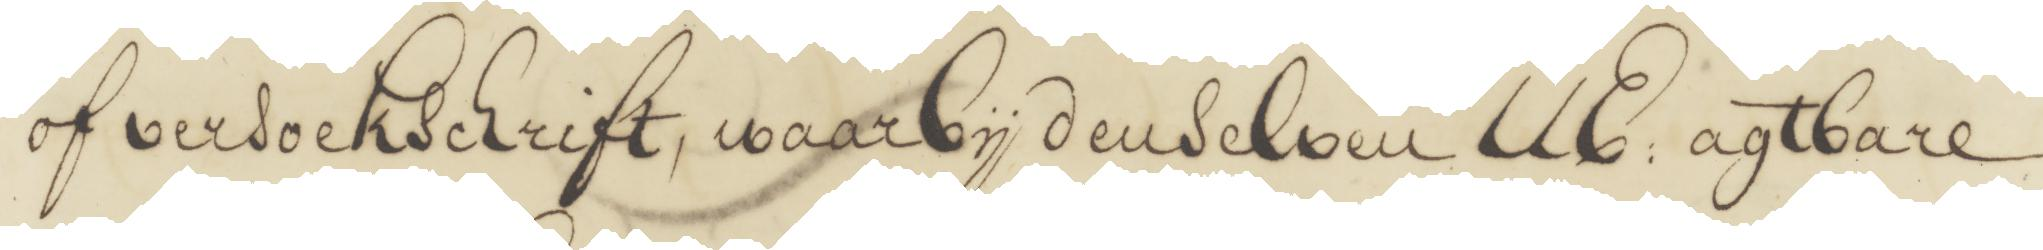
of versoekschrift, waarbij denselven UE: agtbare
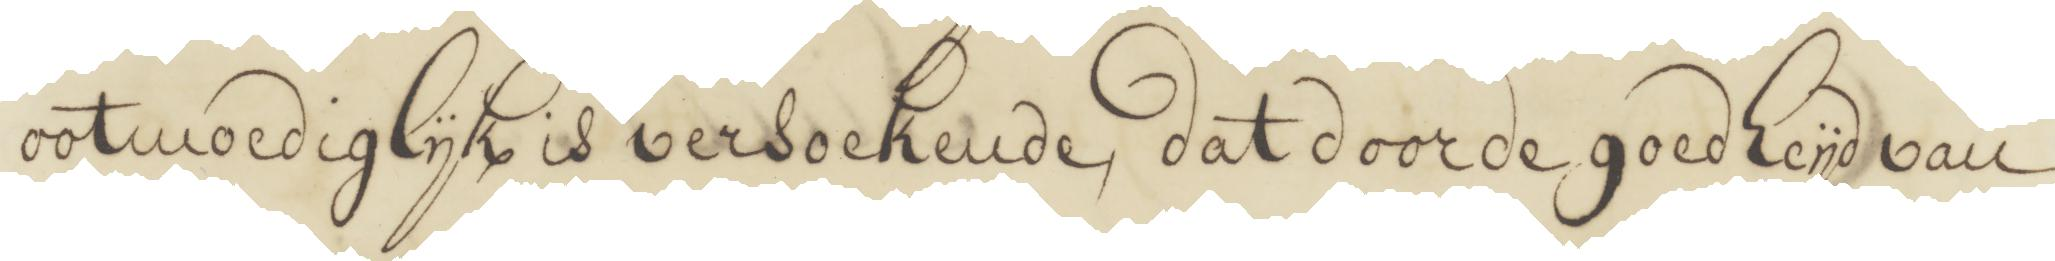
ootmoediglijk is versoekende, dat door de goedheijd van
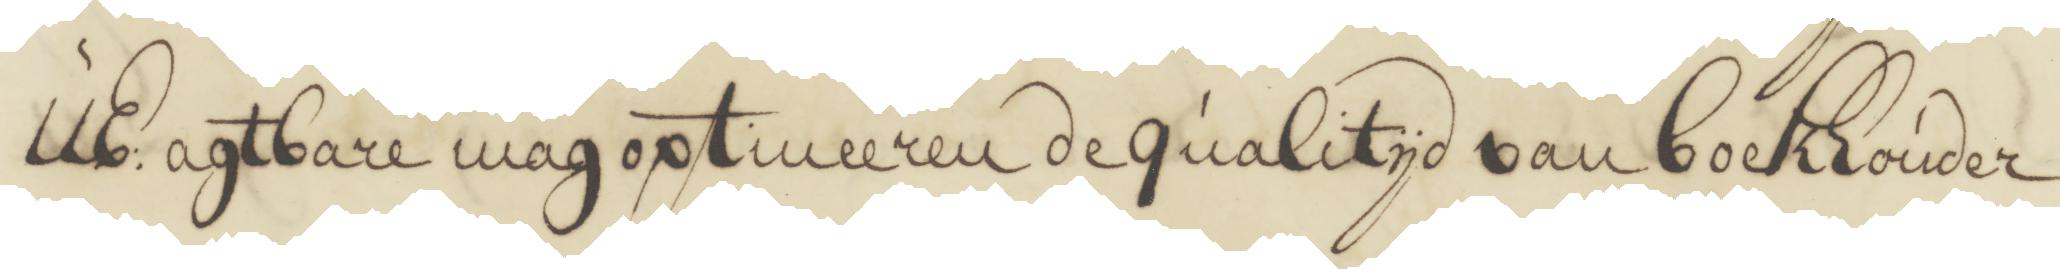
UE: agtbare mag optineeren de qualitijd van boekhouder
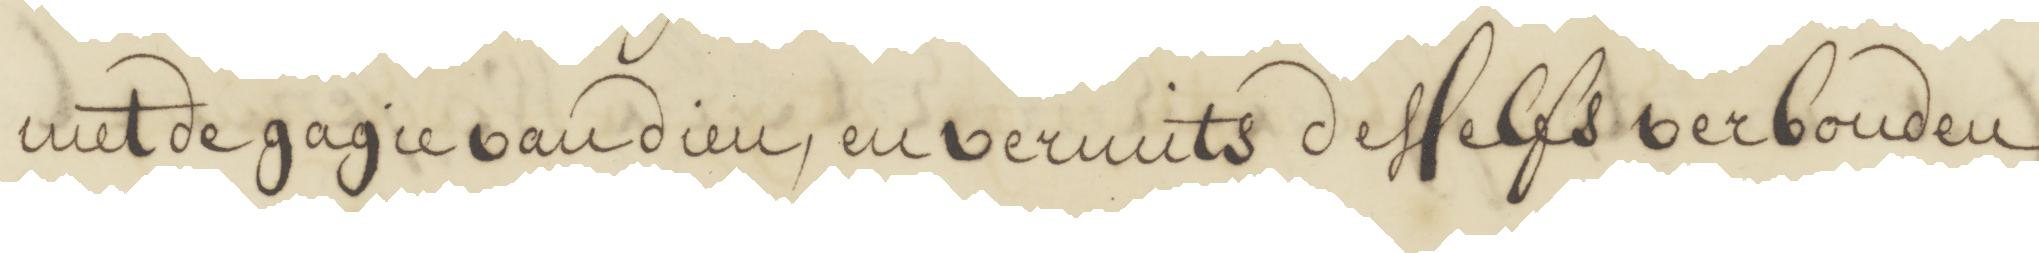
met de gagie van dien, en vermits desselfs verbonden
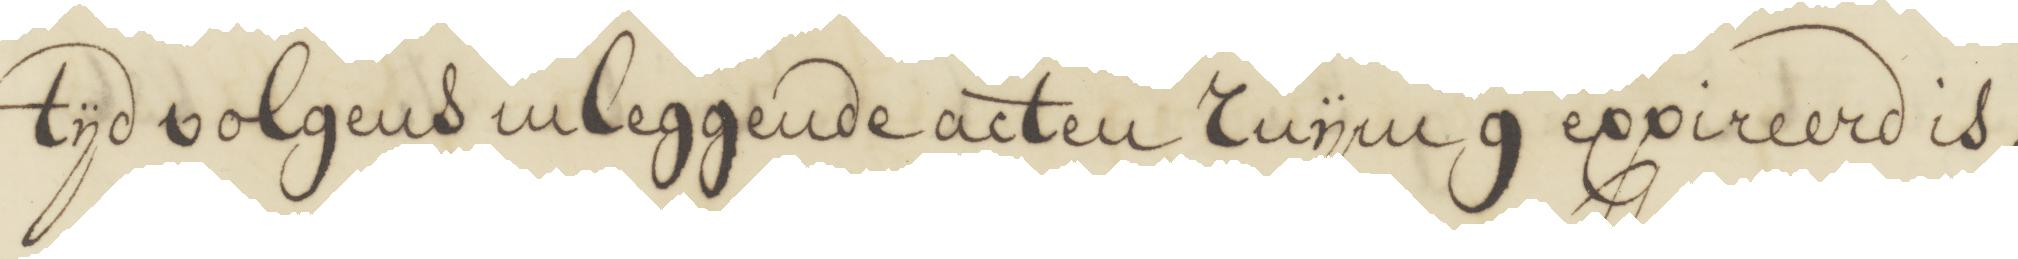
tijd volgens inleggende acten ruijm g’expireerd is,
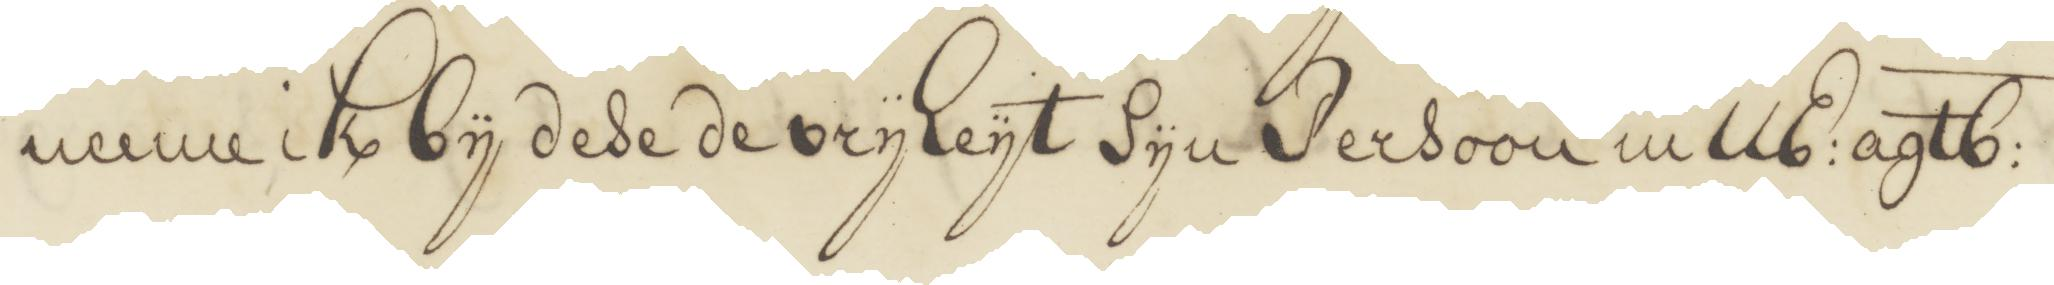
neeme ik bij dese de vrijheijt sijn Persoon in UE: agtb:
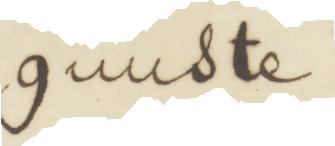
gunste
